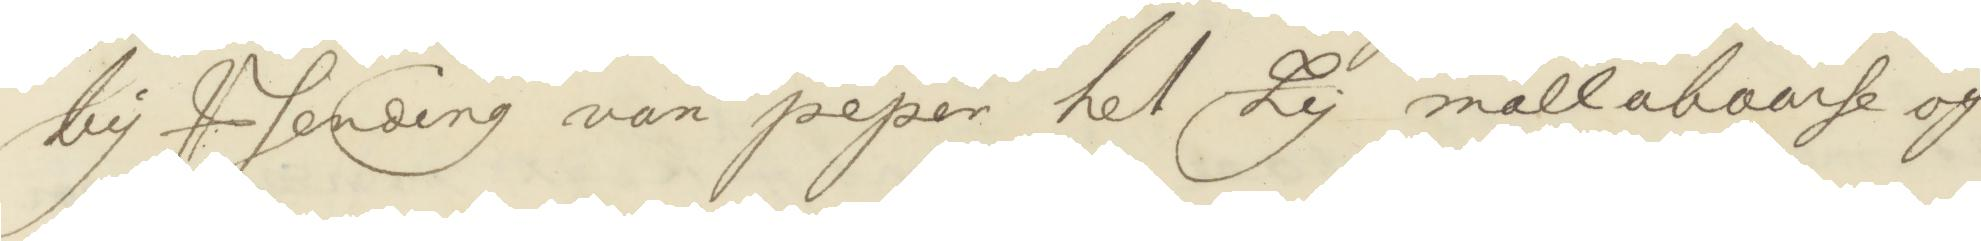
bij versending van peper het zij mallabaarse of
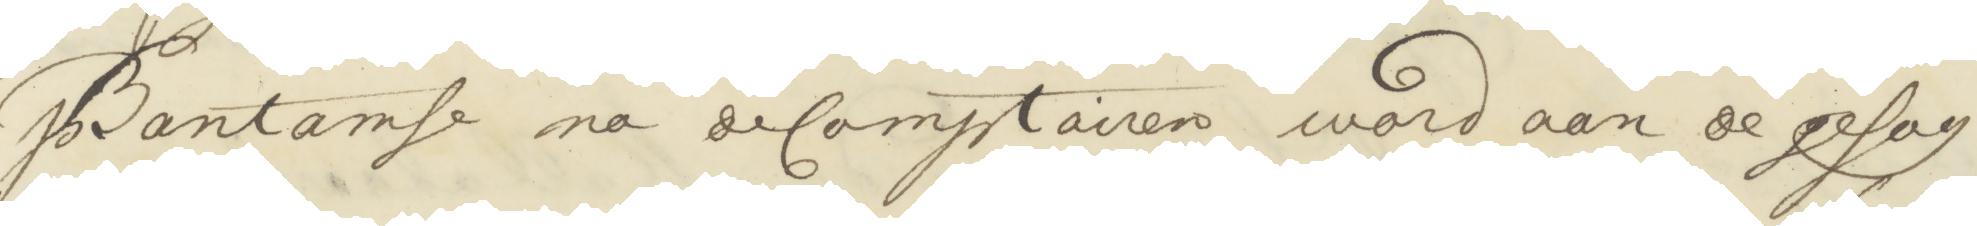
Bantamse na de Comptoiren word aan de gesag
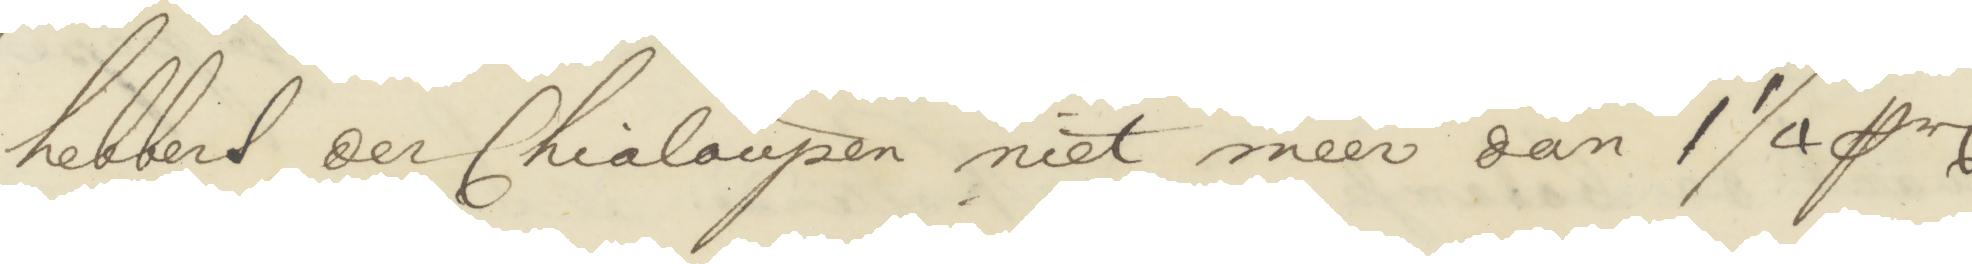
hebbers der Chialoupen niet meer dan 1¼ PrC
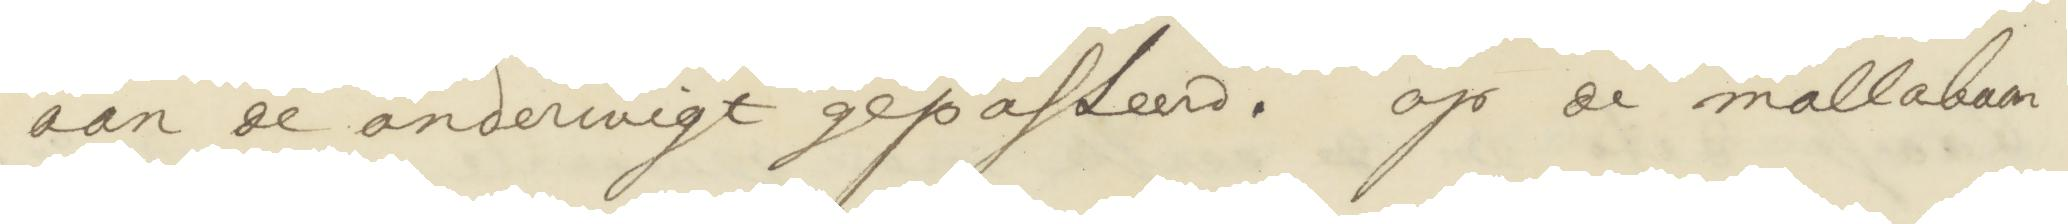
aan de onderwigt gepasseerd. op de mallabaar
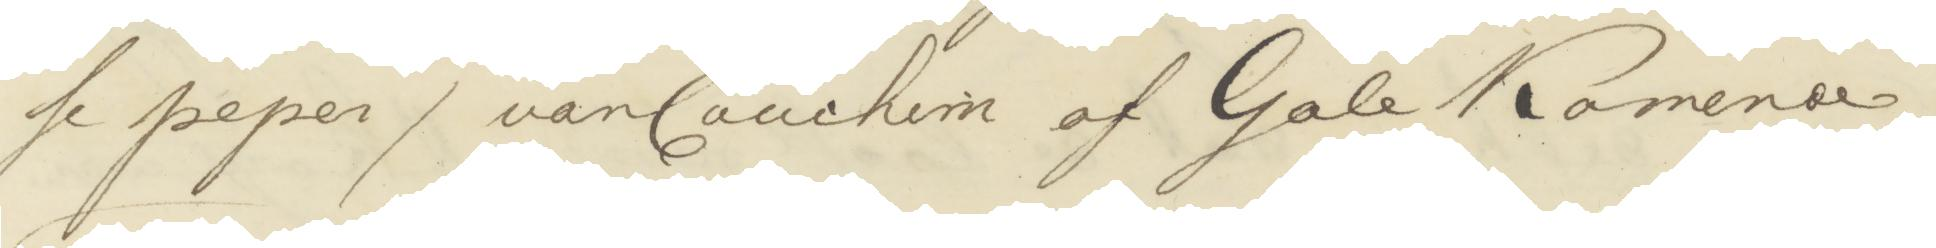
se peper, van Cauchim of Gale Komende,
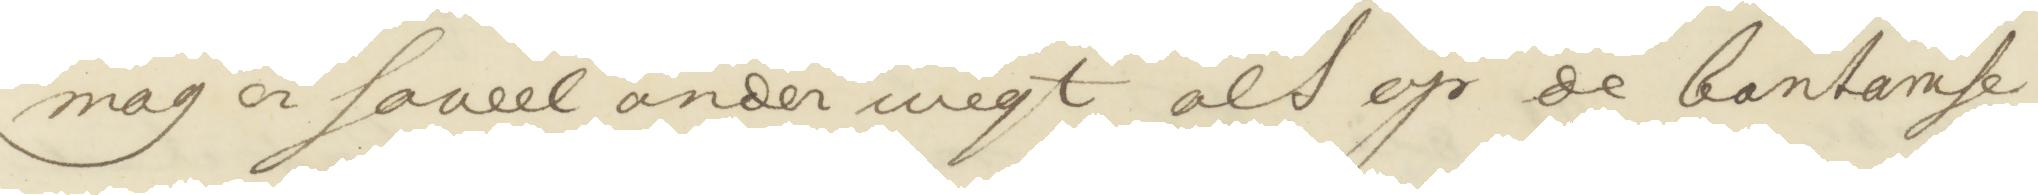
mag er soveel onder wigt als op de bantamse
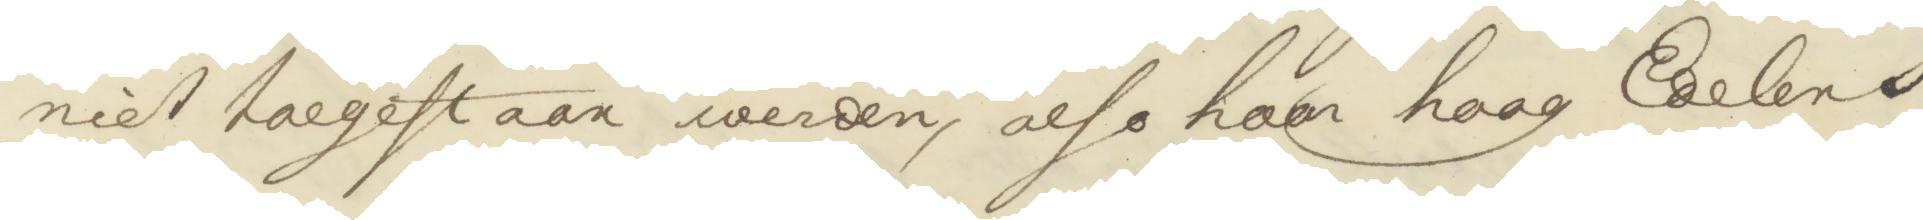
niet toegestaan werden, also haar hoog Edelens
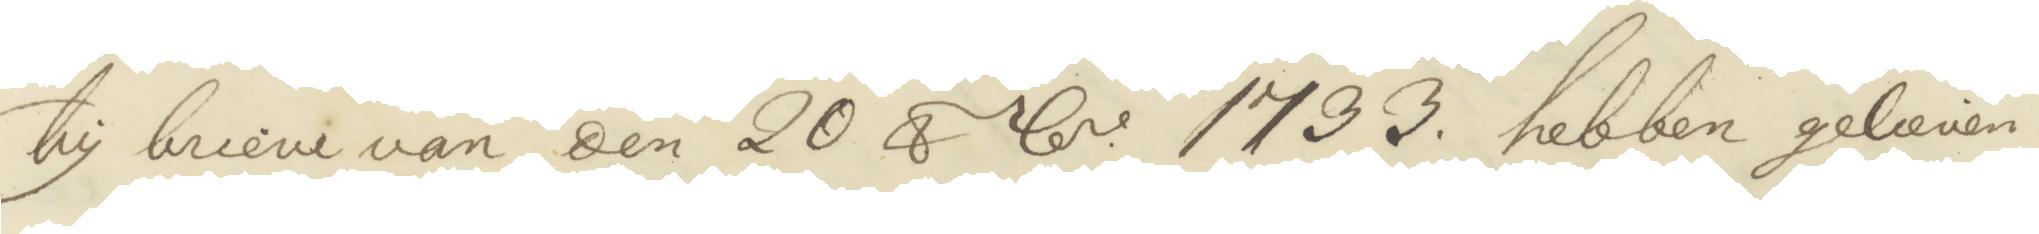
bij brieve van den 20 8br:' 1733. hebben gelieven
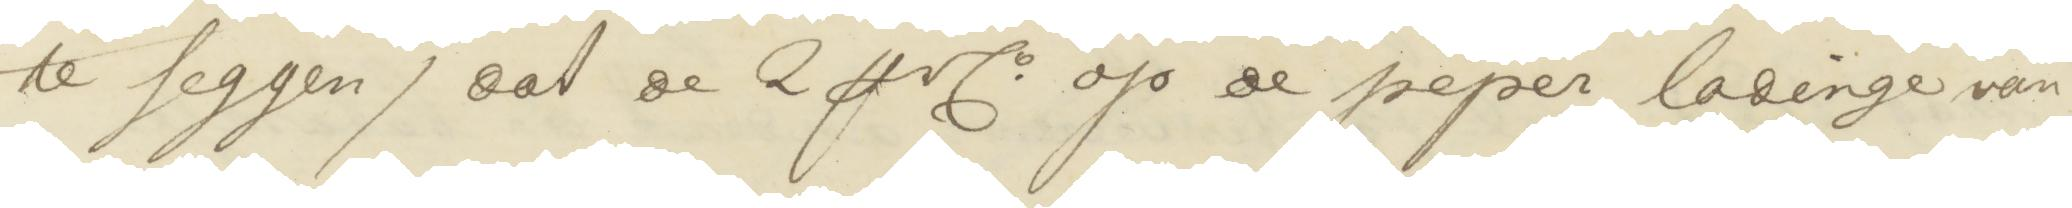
te seggen, dat de 2 Pr C.o op de peper ladinge van
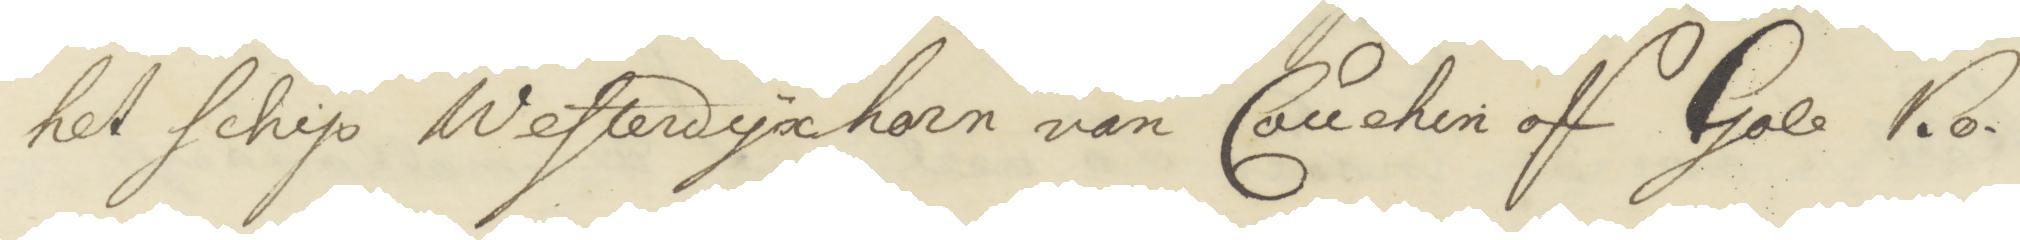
het schip Westerdijxhorn van Couchin over Gale ko-
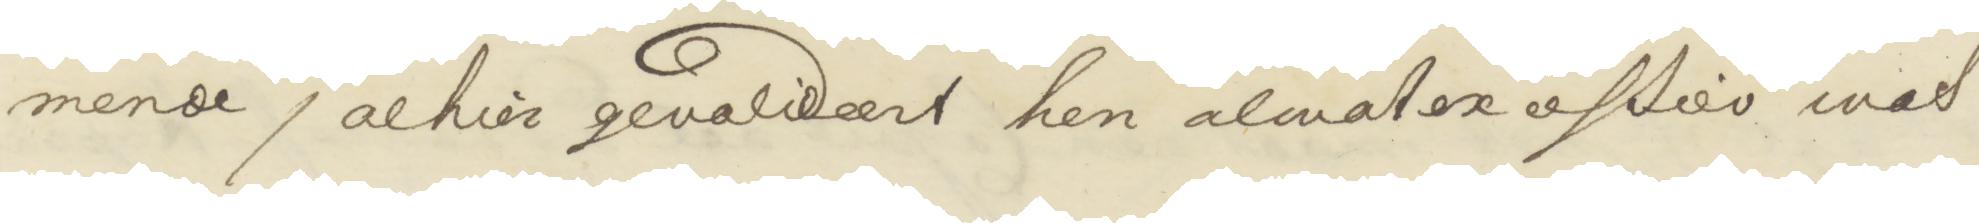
mende, alhier gevalideert hen alwat exessiev was
